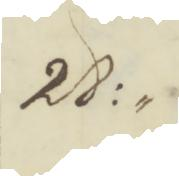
28:„
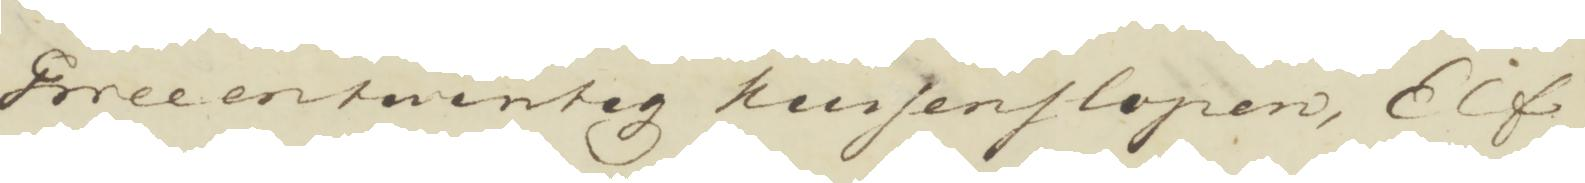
Twee en twintig kussenslopen, Elf
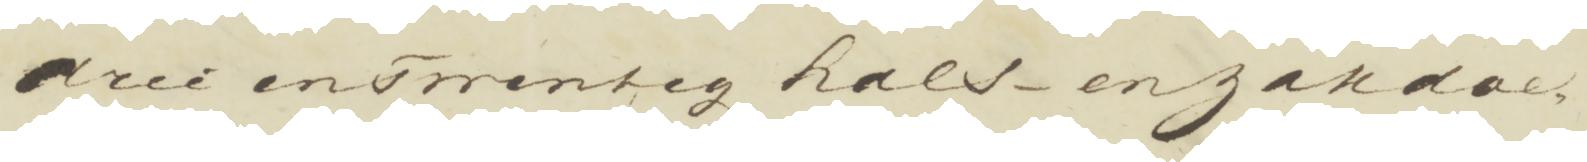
drie en Twintig hals- en zak doe„
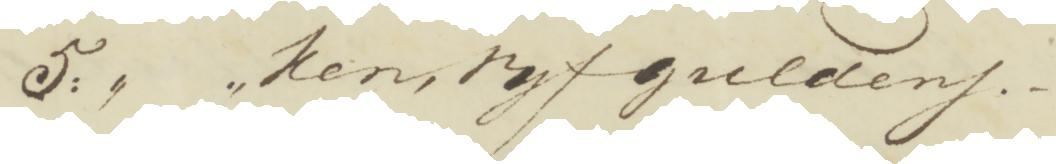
5: „ „ken, vyf guldens.-
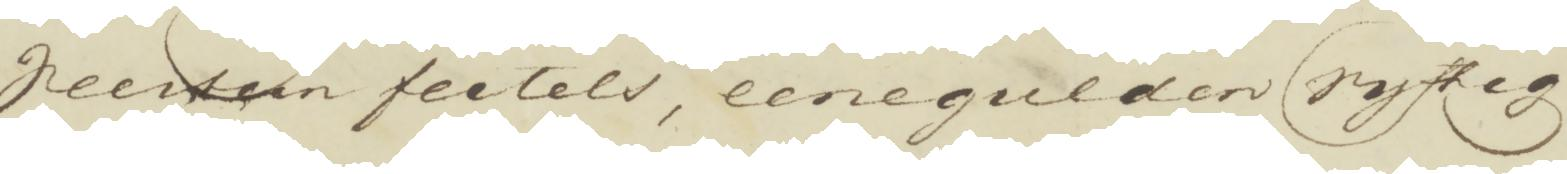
Veertien feitels, eene gulden vyftig
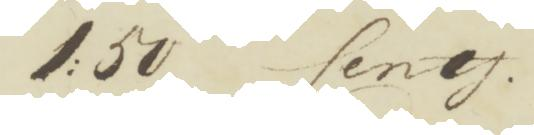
1:50 Cents.
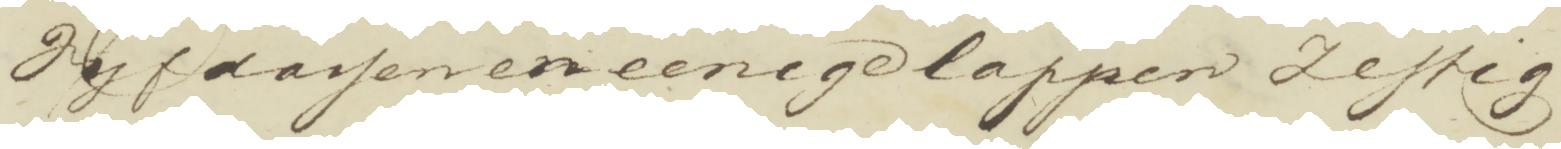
Vyf dassen en eenige lappen Zestig
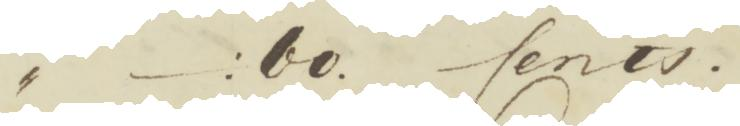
„ —: 60. Cents.
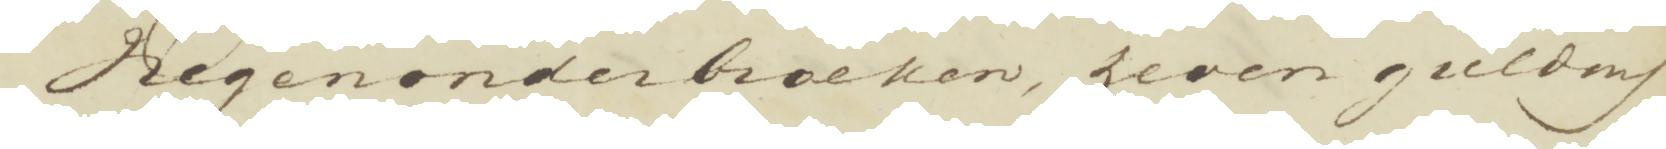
Negen onderbroeken, zeven guldens
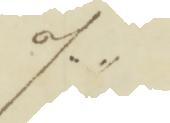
ƒ.„
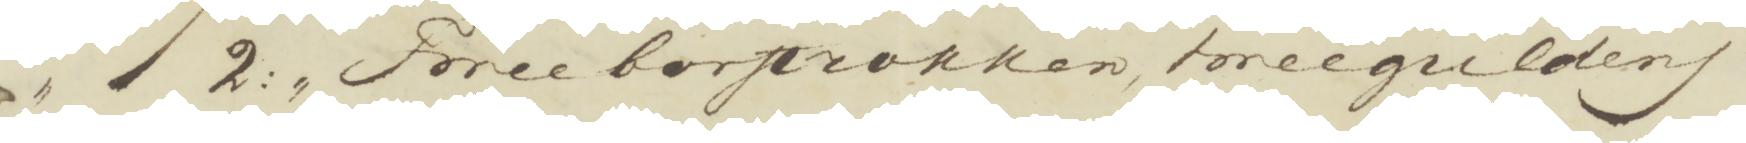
„ 2: „ Twee borstrokken, twee guldens
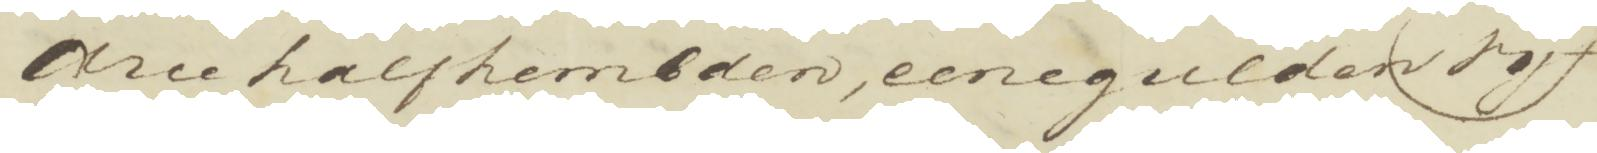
drie halfhembden, eene gulden vyf
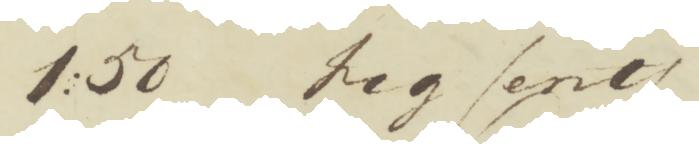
1:50 tig Cents
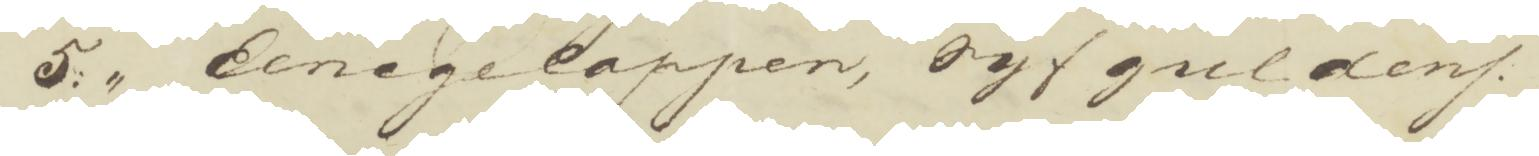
5:„ Eenige lappen, vyf guldens.
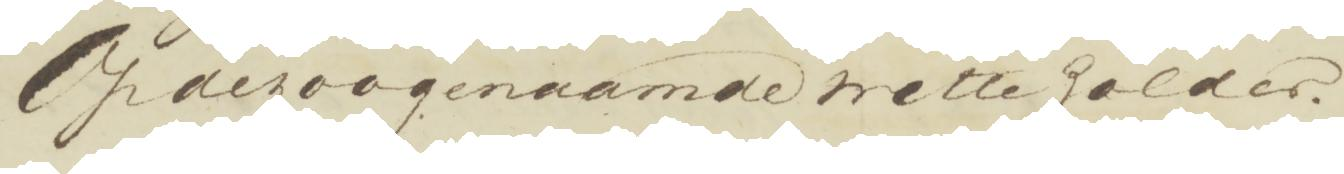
Op de zoogenaamde witte zolder.
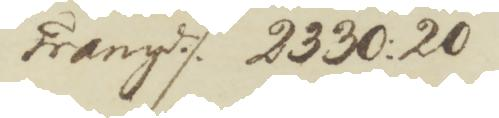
Transp.t ƒ. 2330:20
